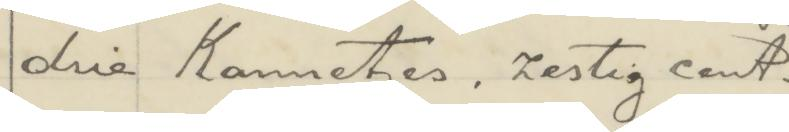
drie kannetjes, zestig cent.
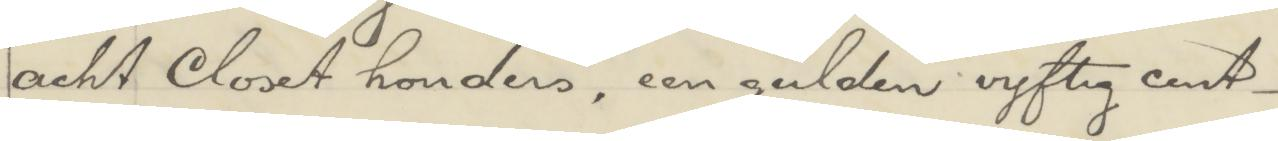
acht Closet houders, een gulden vyftig cent
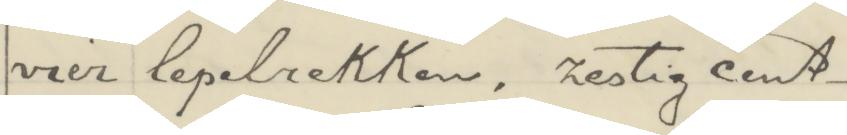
vier lepelrekken, zestig cent
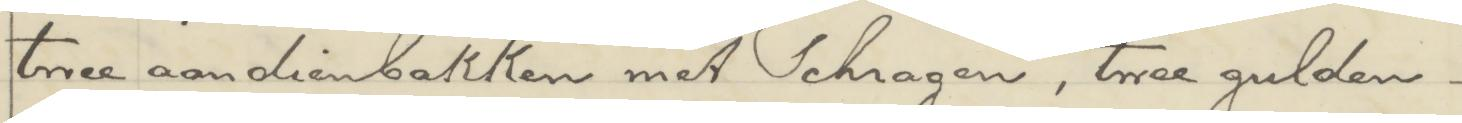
twee aandienbakken met schragen, twee gulden
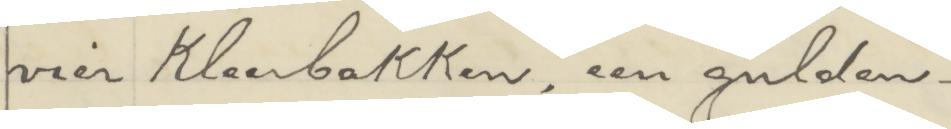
vier kleerbakken, een gulden
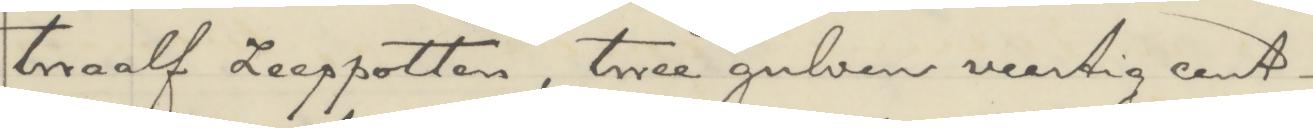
twaalf zeeppotten, twee gulden veertig cent
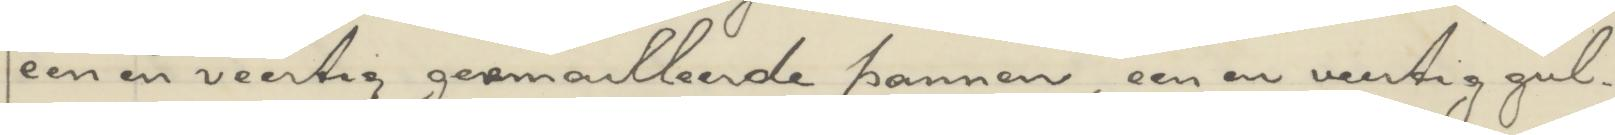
een en veertig geemailleerde pannen, een en veertig gul
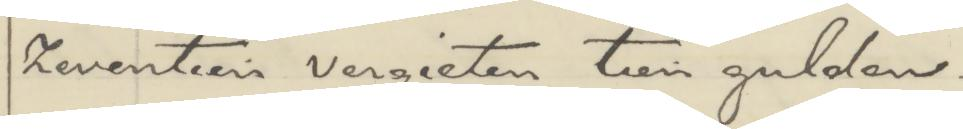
Zeventien vergieten tien gulden.
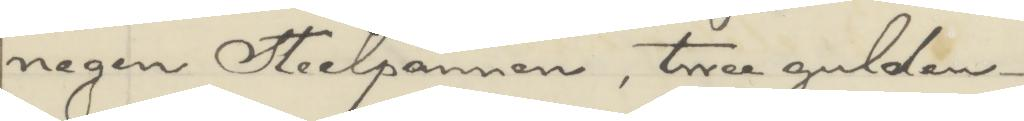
negen steelpannen, twee gulden
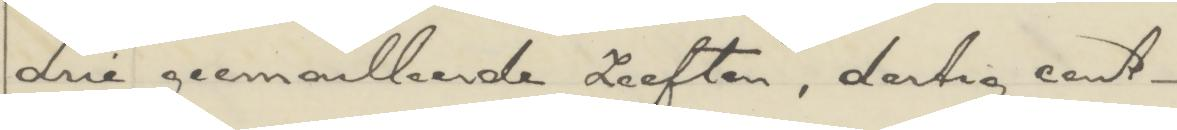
drie geemailleerde zeeften, dertig cent-
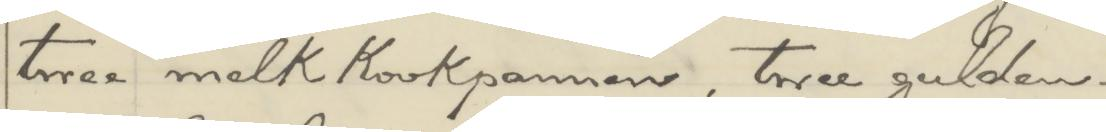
twee melk kookpannen, twee gulden.
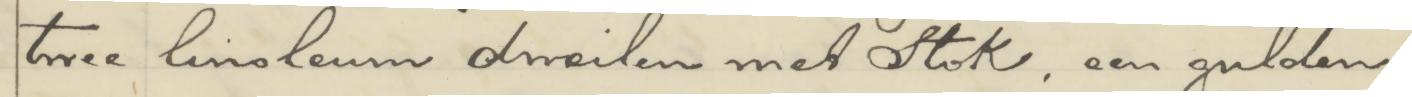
twee linoleum dweilen met stok, een gulden
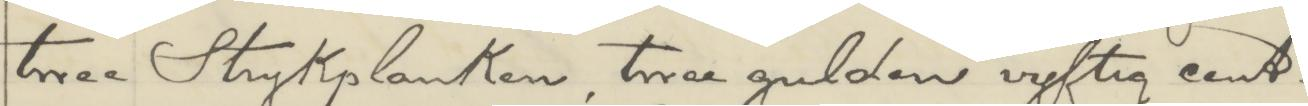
twee strykplanken, twee gulden vyftig cent.
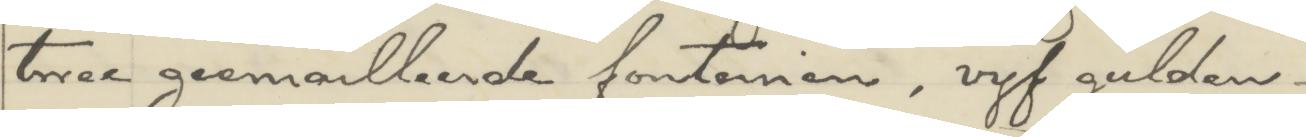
twee geemailleerde fonteinen, vyf gulden
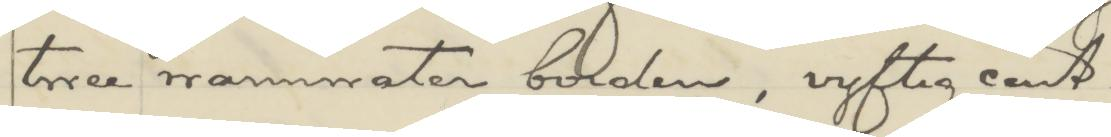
twee warmwater borden, vyftig cent
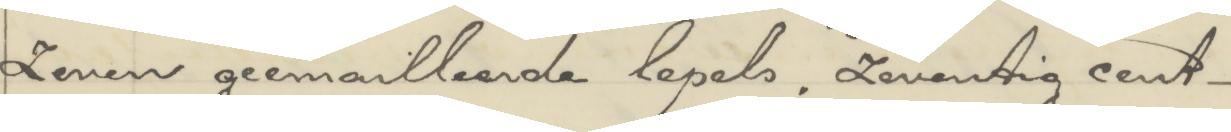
zeven geemailleerde lepels, zeventig cent-
